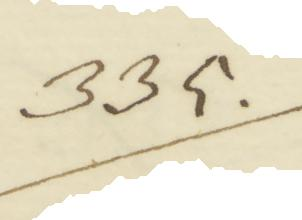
335.
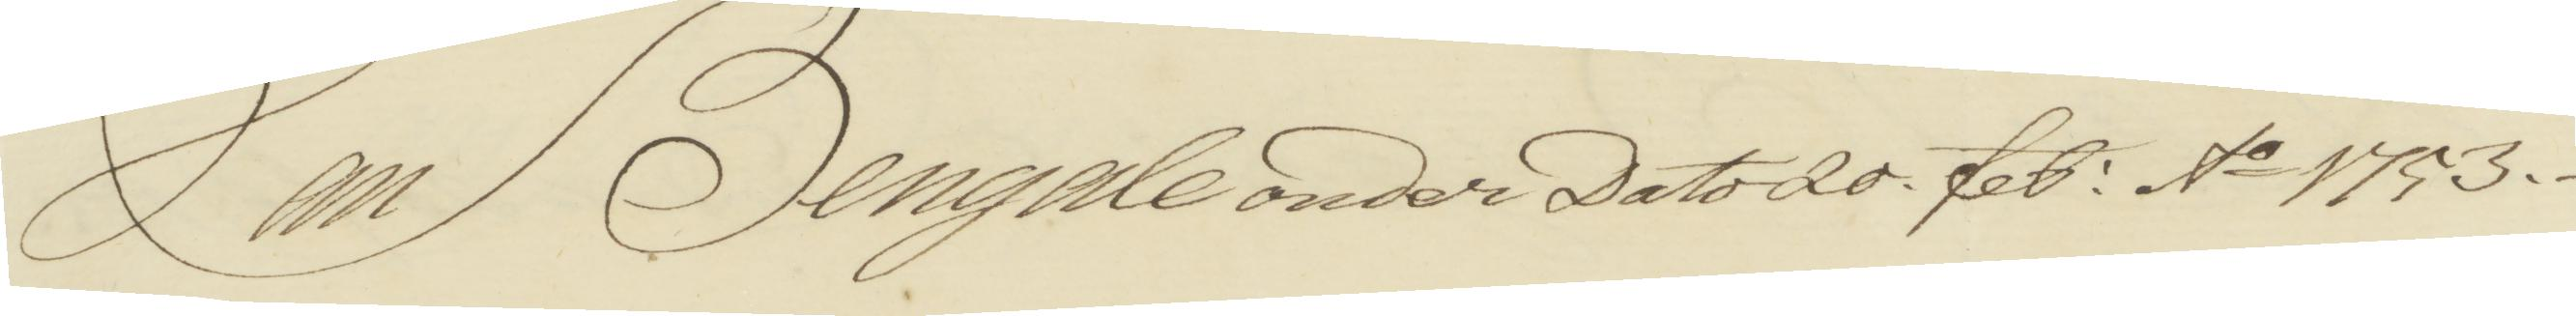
Van Bengale onder Dato 20. feb: A=o 1753.-
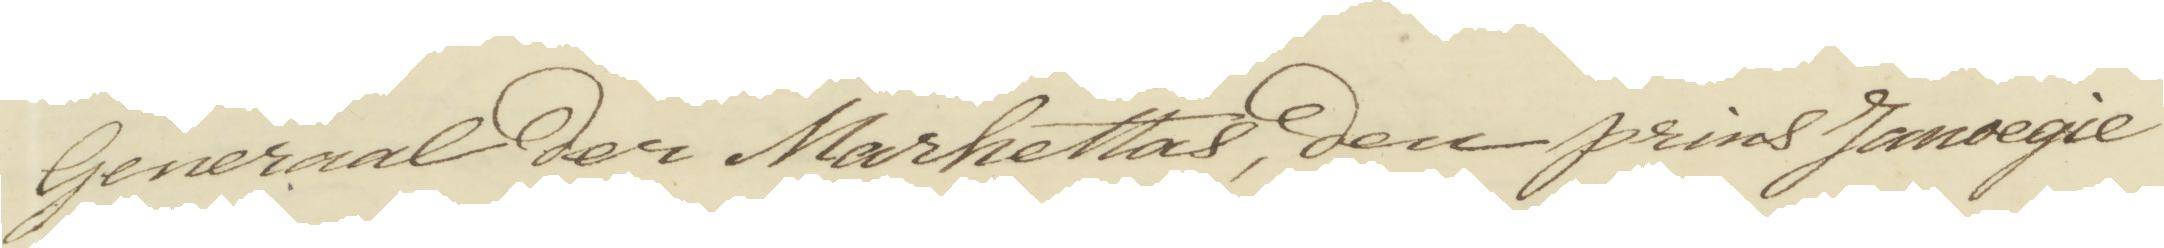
Generaal der Marhettas, den prins Janoegie
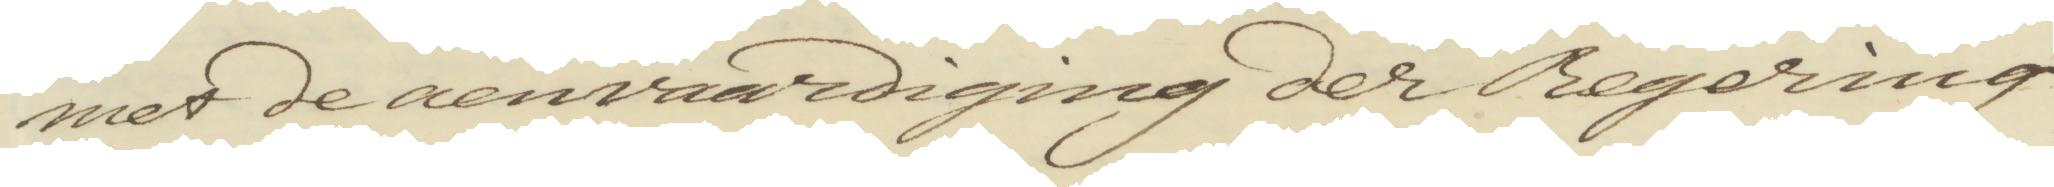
met de aenvaardiging der Regering
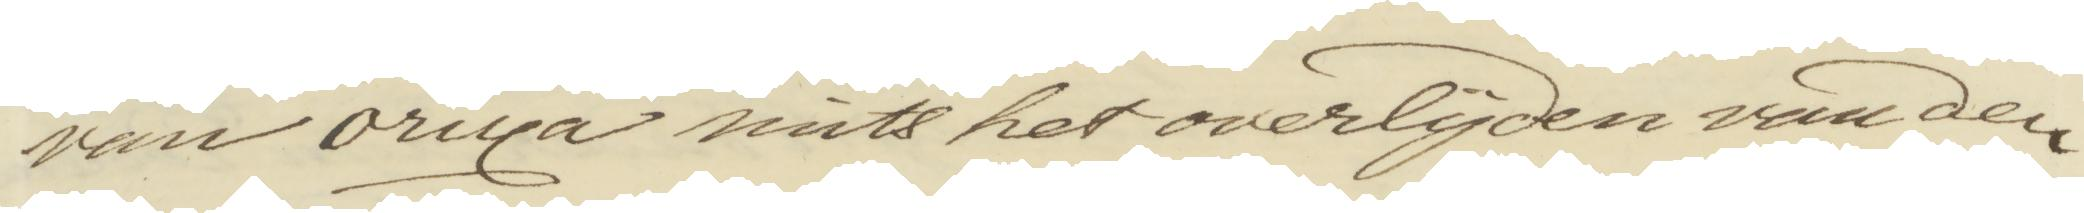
van orixa mits het overlijden van den
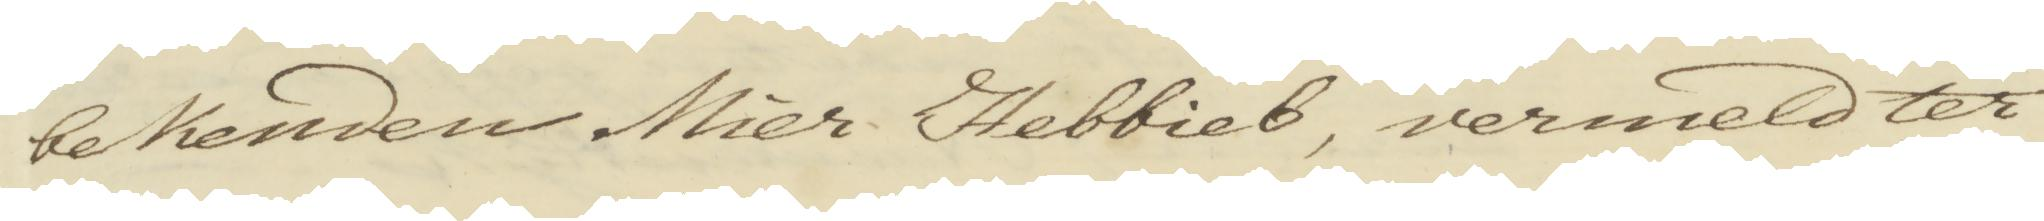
bekenden Mier Hebbieb, vermeld ter
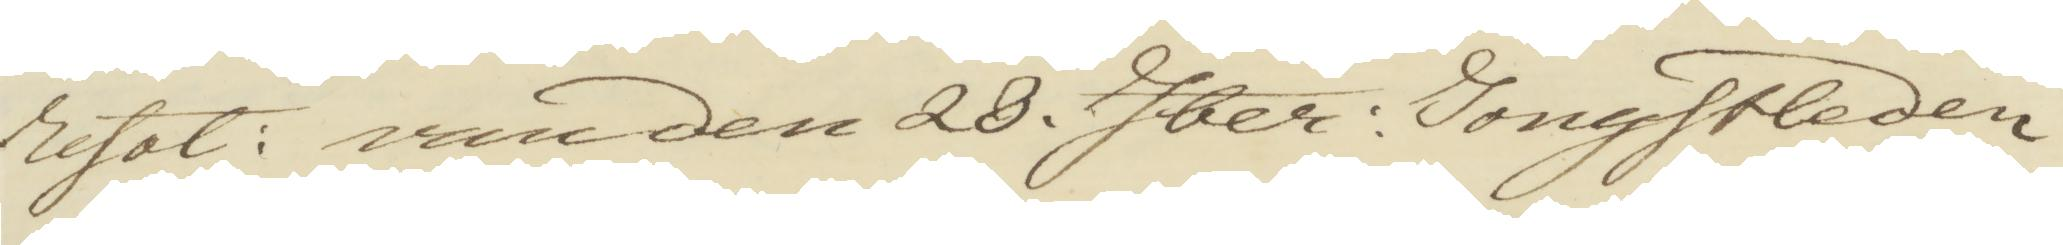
Resol: van den 28. 7ber: Iongstleden
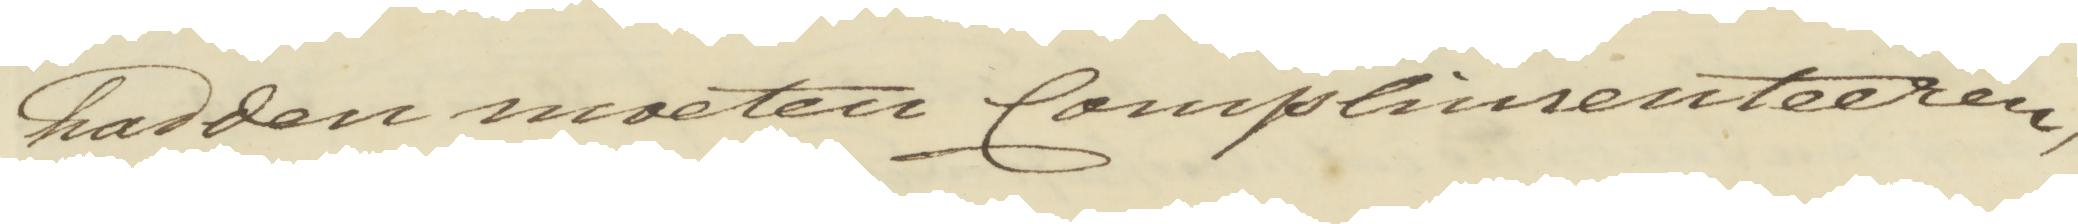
hadden moeten Complimenteeren,
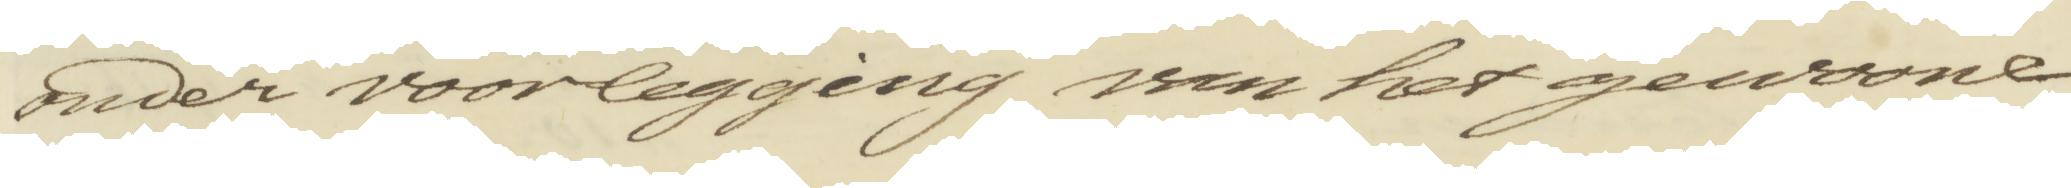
onder voorlegging van het gewoone
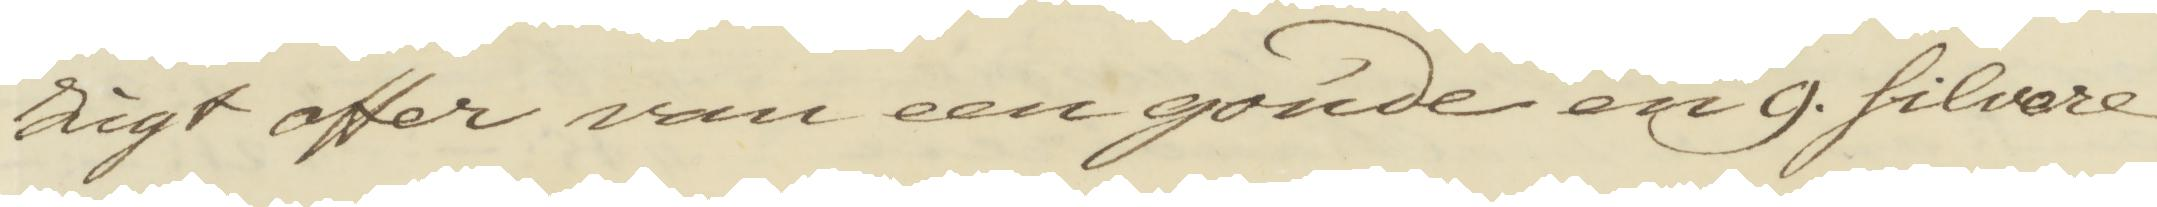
zigt offer van een goude en 9. silvere
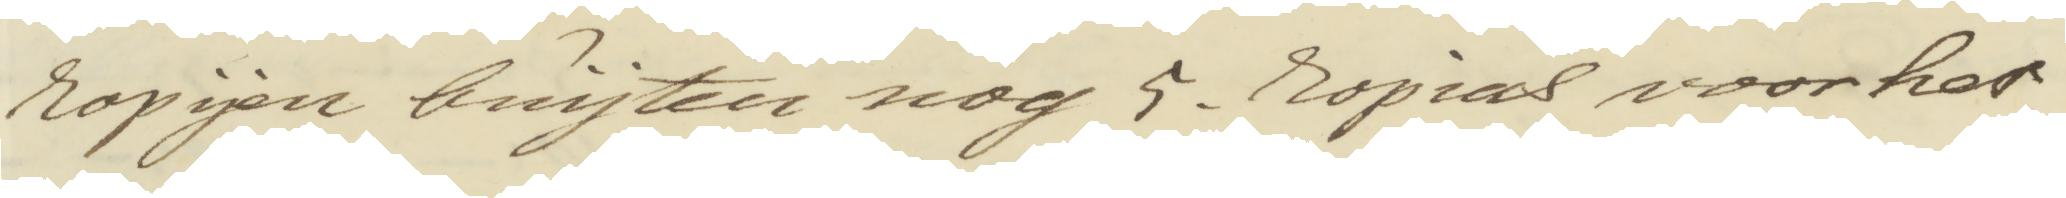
ropijen buijten nog 5. ropias voor het
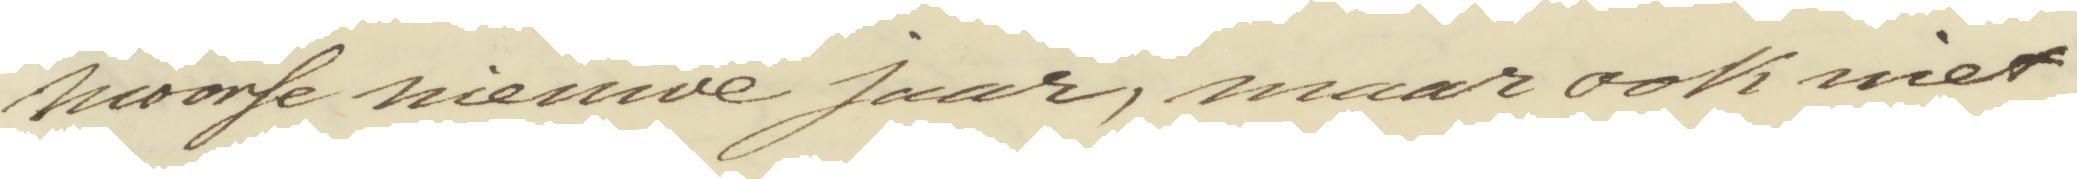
moorse nieuwe jaar, maar ook niet
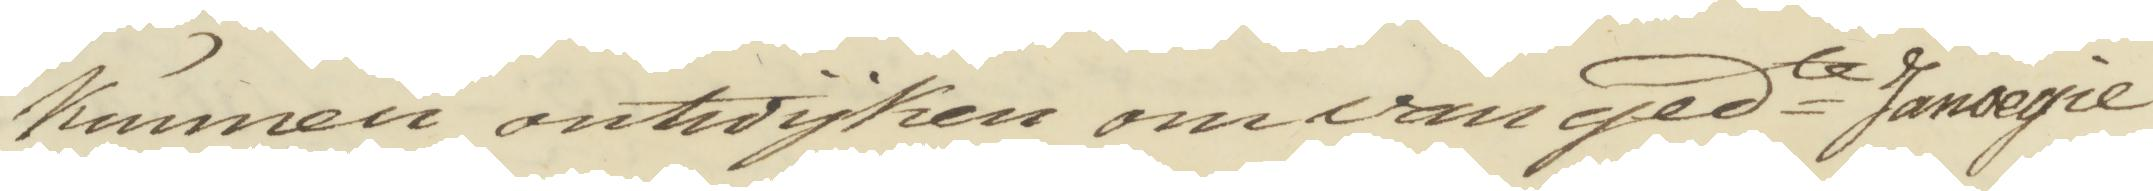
Kunnen ontwijken om van ged=te Janoegie
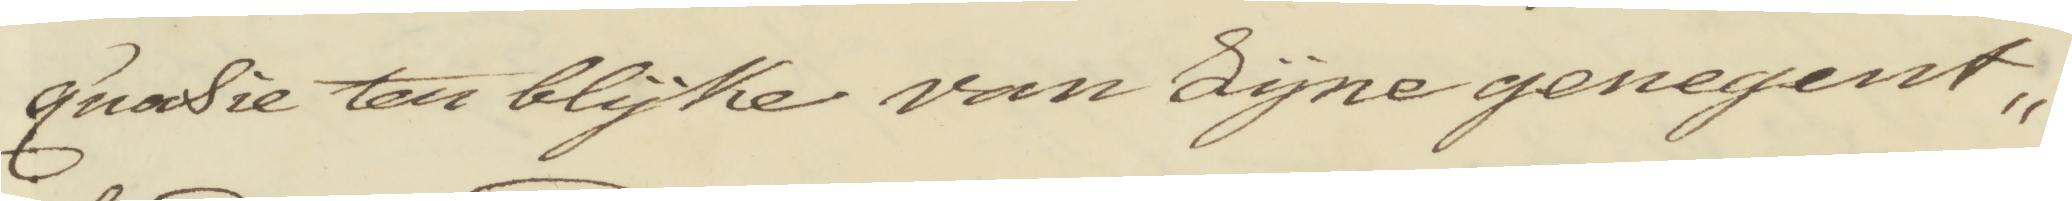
quasie ten blijke van Zijne genegent„
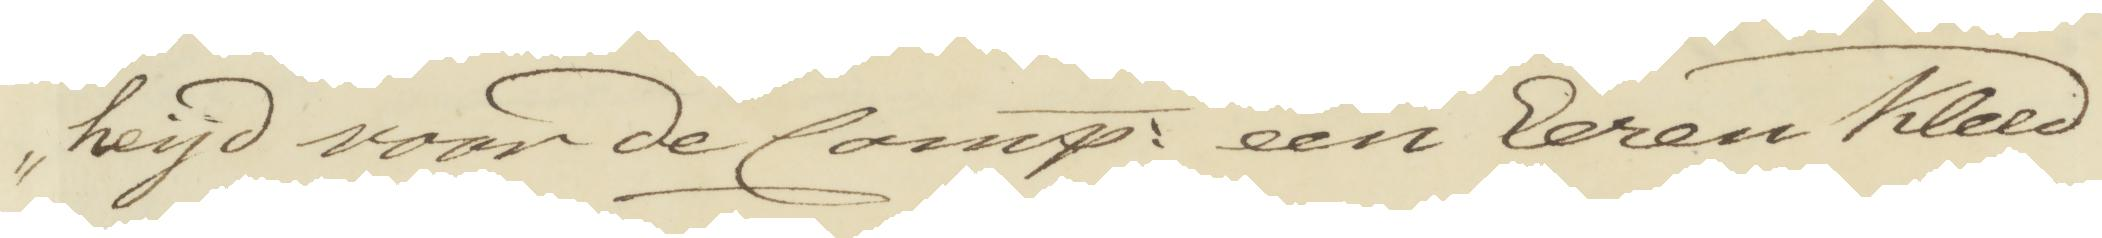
„heijd voor de Comp: een heren Kleed
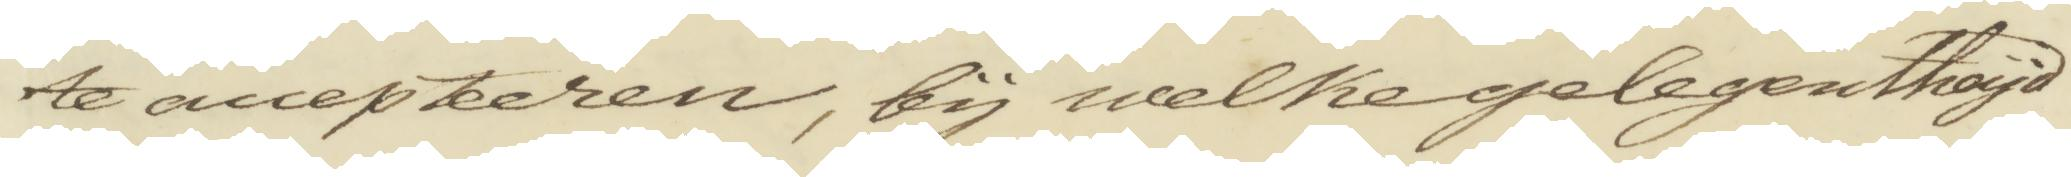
te accepteeren, bij welke gelegentheijd
